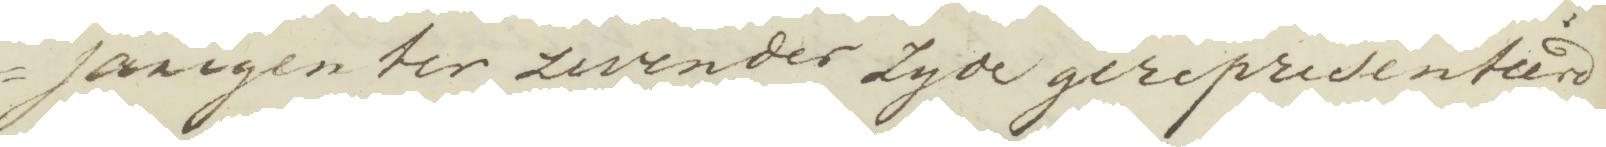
= jarigen ter zevender zyde gerepresenteerd
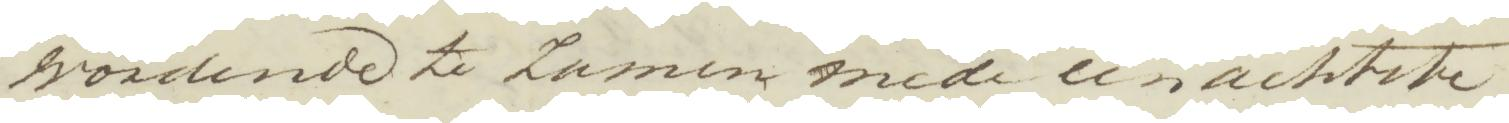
wordende te zamen mede een achtste,
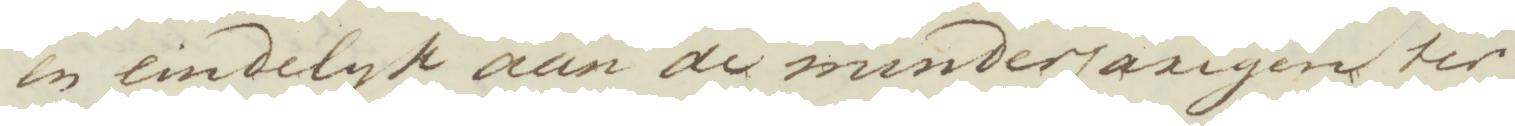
en eindelyk aan de minderjarigen ter
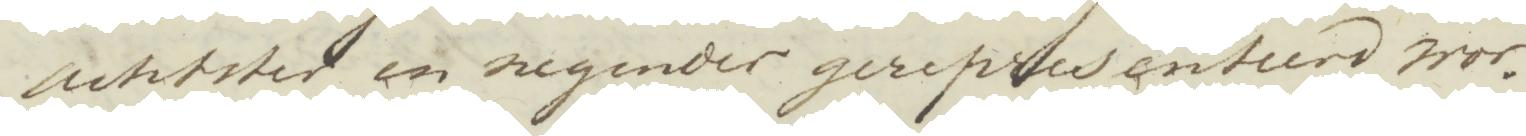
achtster en negender gerepresenteerd wor„
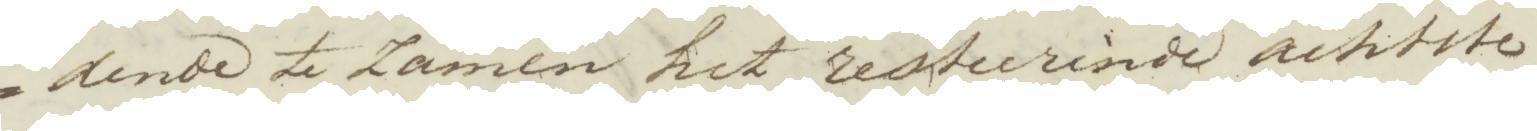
= dende te zamen het resteerende achtste
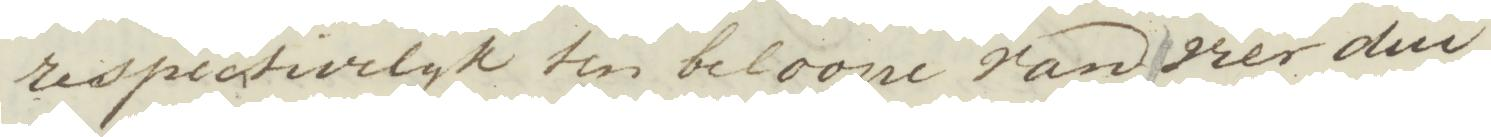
respectivelyk ten beloope van vier dui:
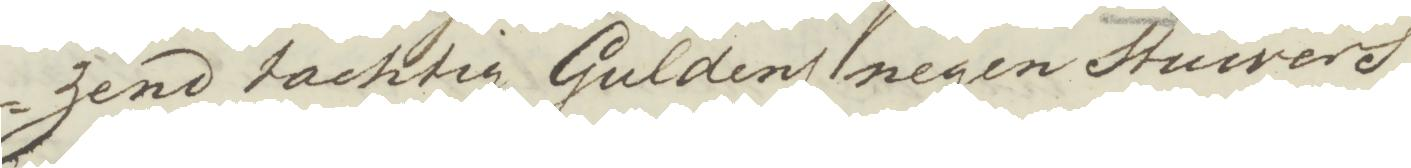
= zend tachtig Guldens negen stuivers
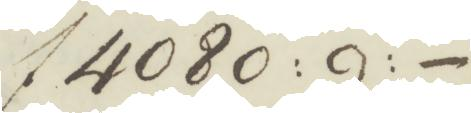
ƒ 4080 : 9 : —
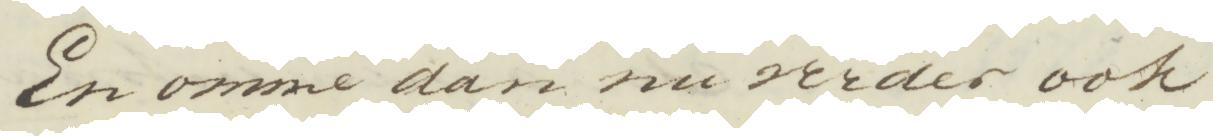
En omme dan nu verder ook
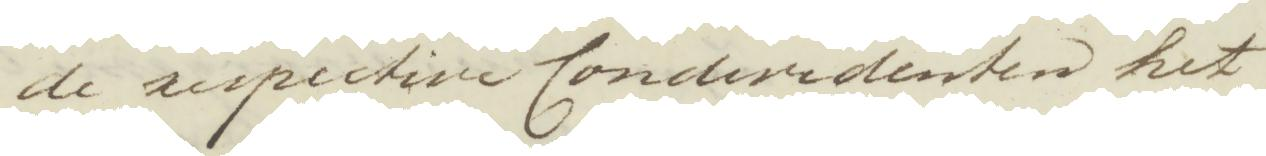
de respective Condividenten het
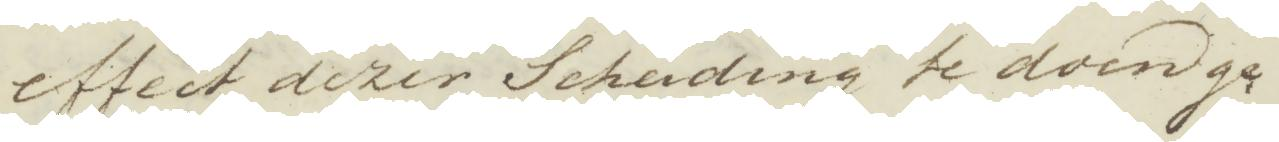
effect dezer scheiding te doen ge„
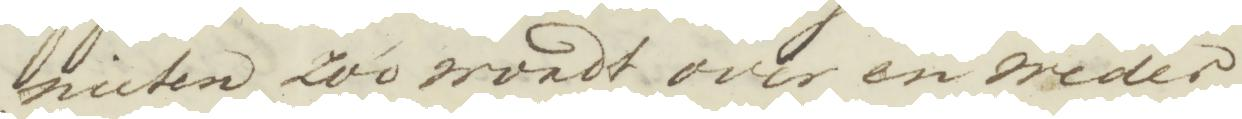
nieten, zoo wordt over en weder,
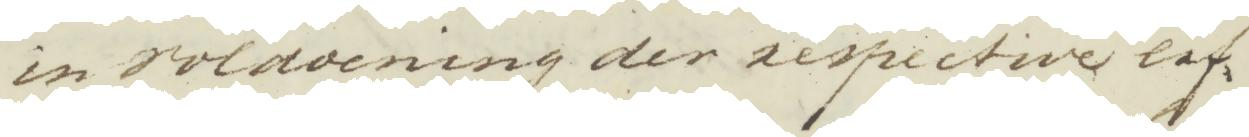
in voldoening der respective erf„
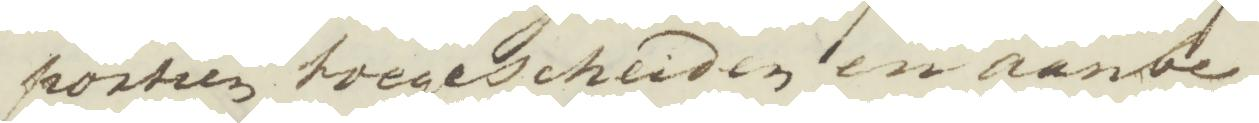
portien toegescheiden en aanbe:
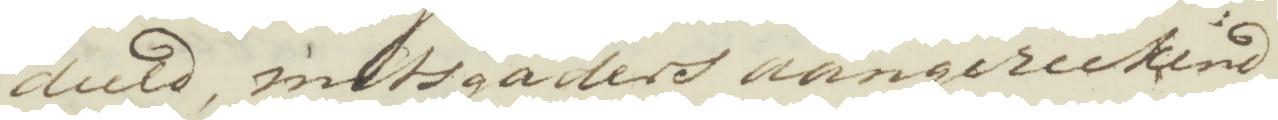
deeld, mitsgaders aangereekend,
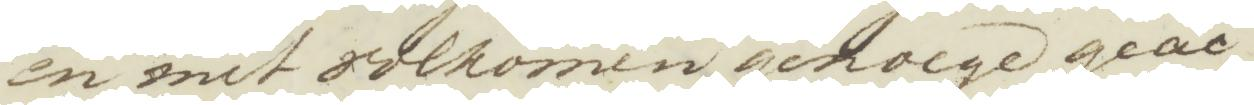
en met volkomen genoege geac„
